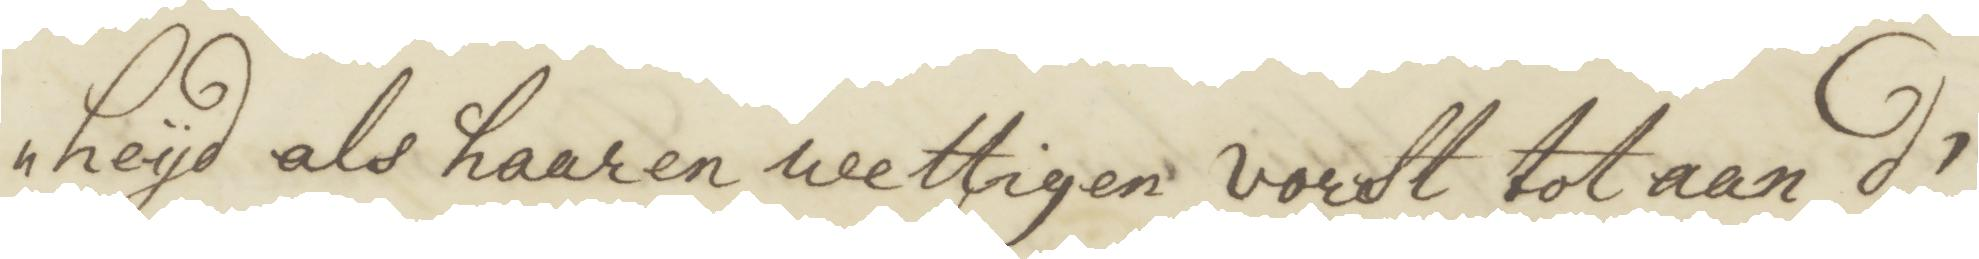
heijd als haaren wettigen vorst tot aan d'
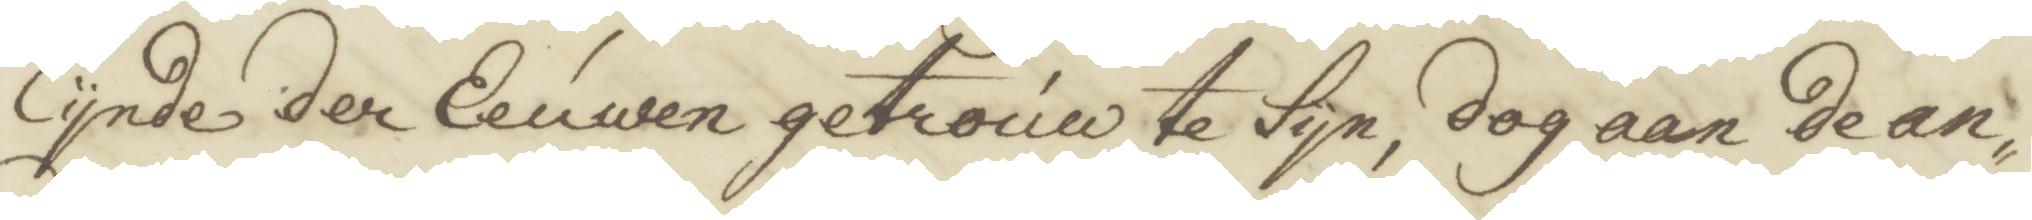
Eijnde der Eeuwen getrouw te sijn, dog aan de an„
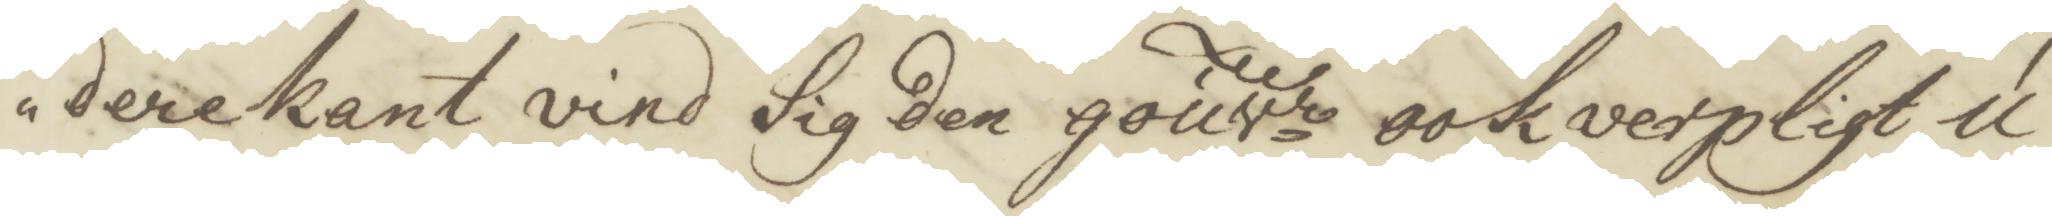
„dere kant vind sig den gouv=r ook verpligt u
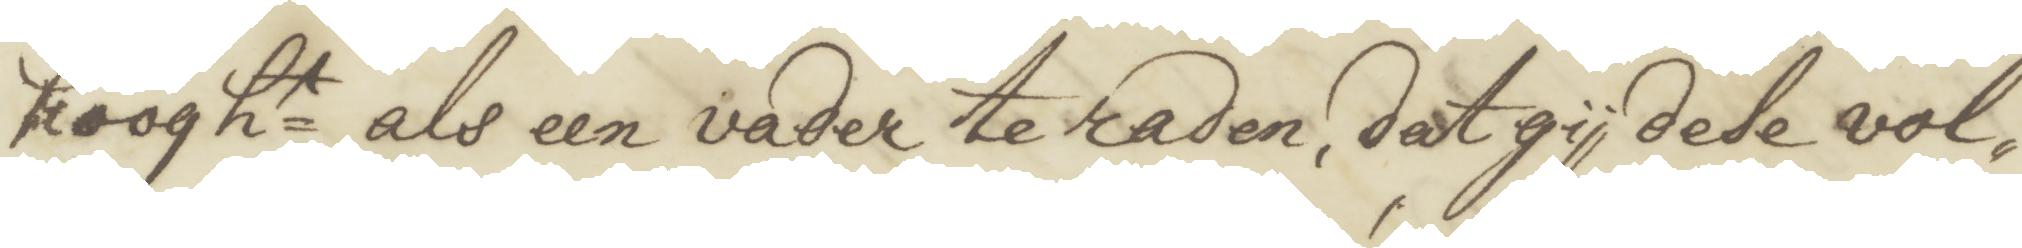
hoogh=t als een vader te raden, dat gij dese vol„
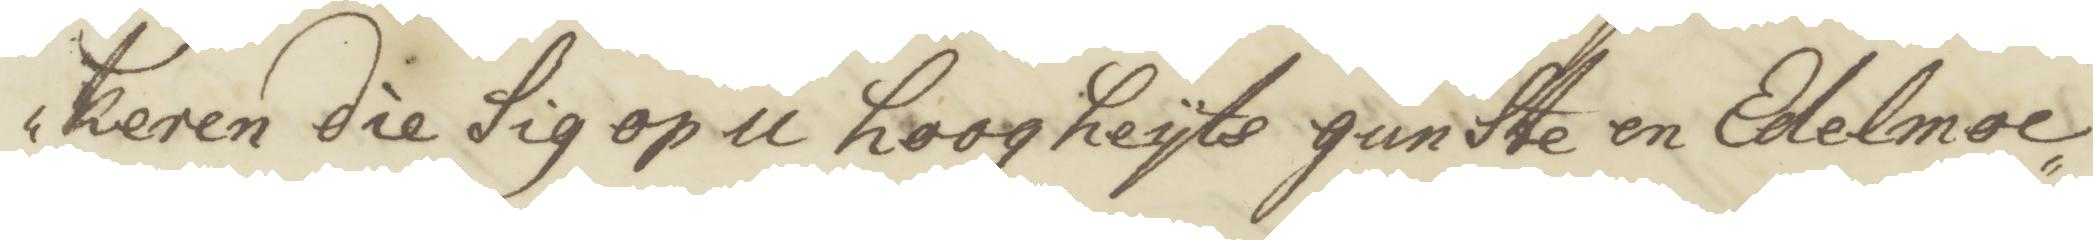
„keren die sig op u hoogheijts gunste en Edelmoe„
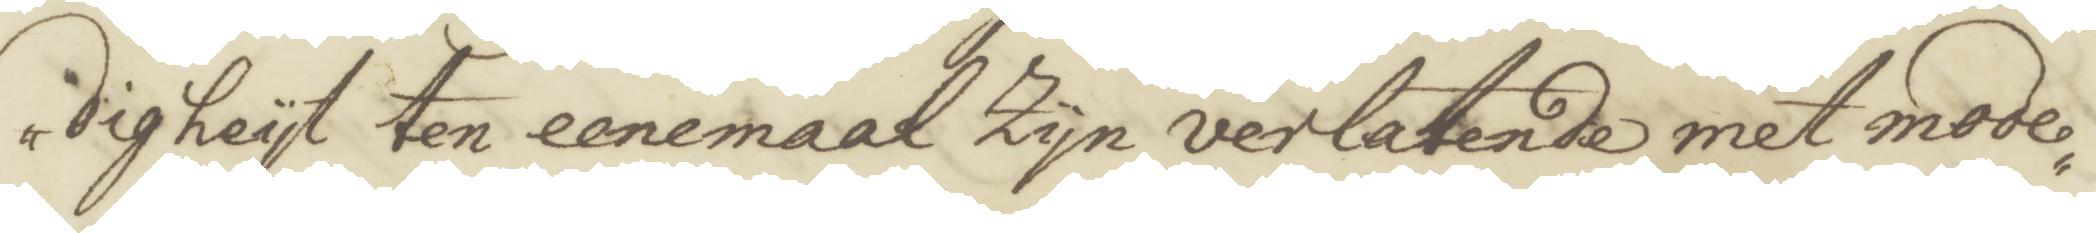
„digheijt ten eenemaal zijn verlatende met mode„
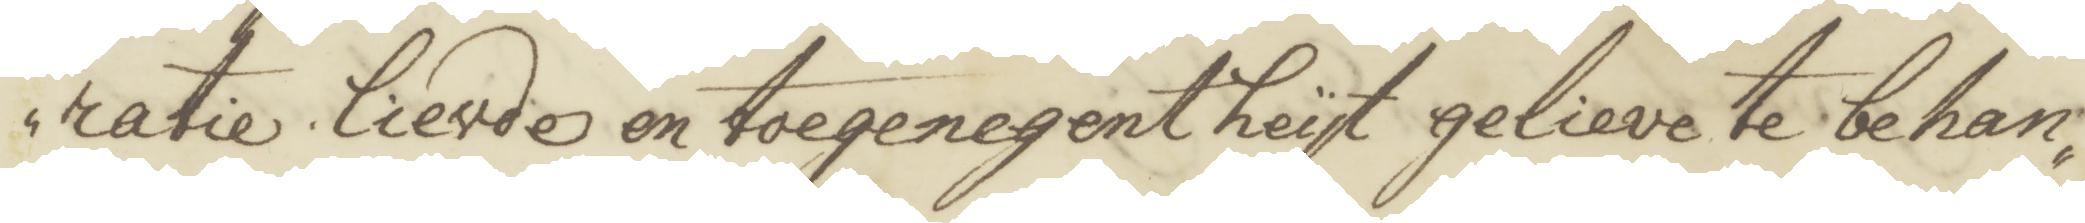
„ratie lievde en toegenegentheijt gelieve te behan„
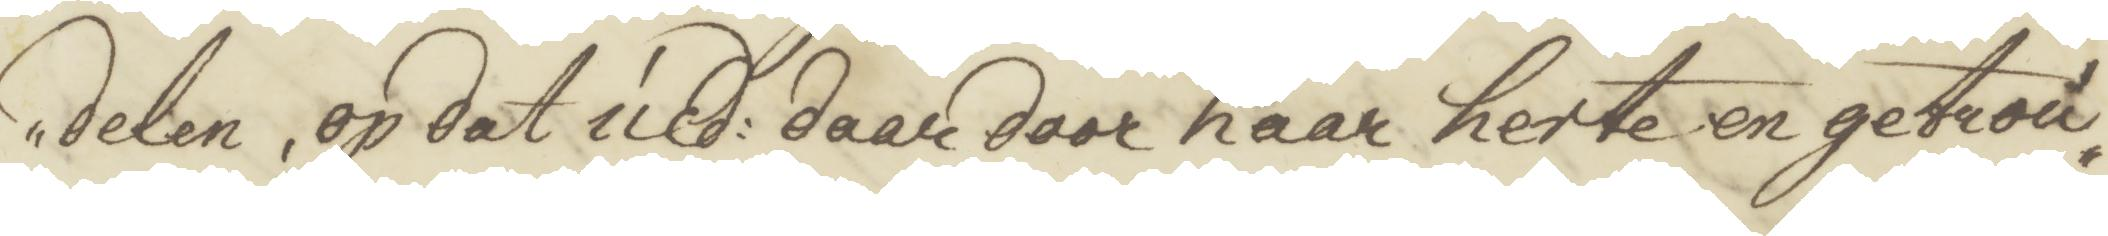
„delen, op dat uEd: daar door haar herte en getrou
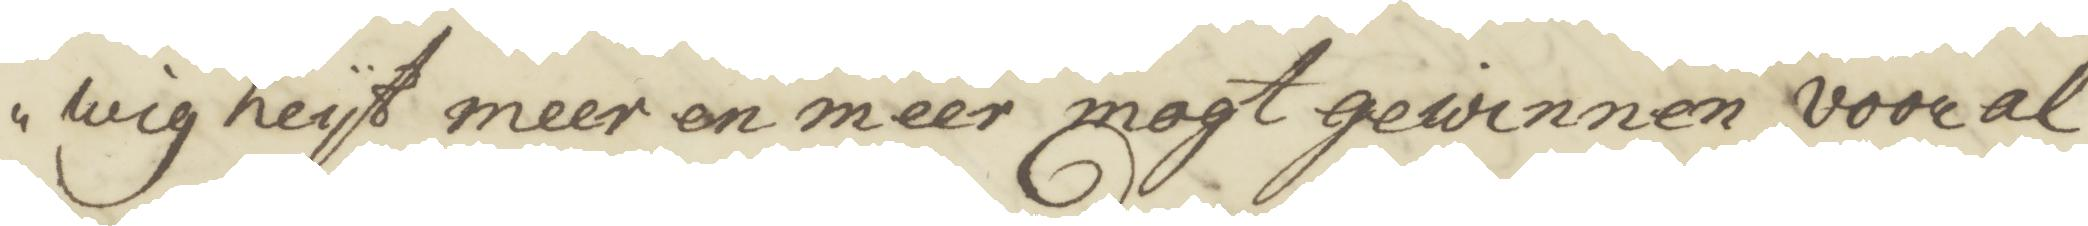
„wigheijt meer en meer mogt gewinnen, voor al
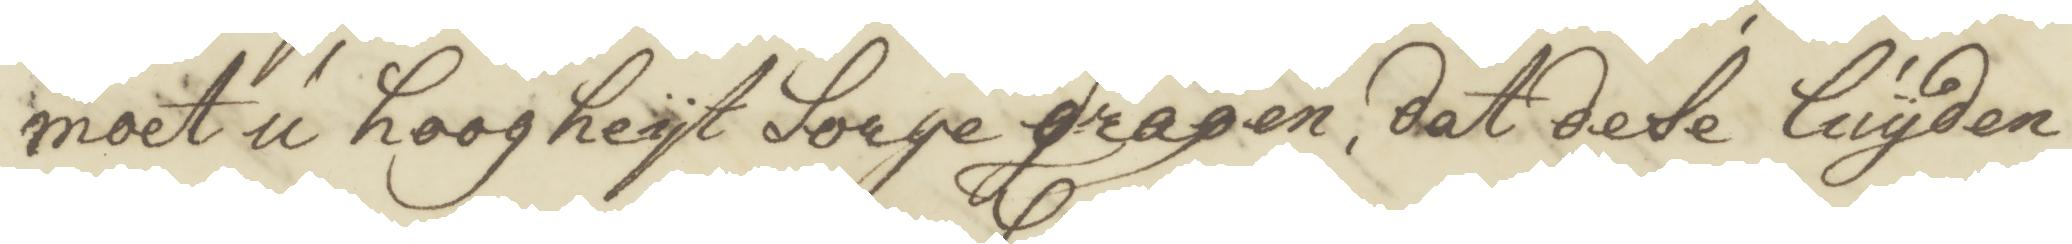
moet u hoogheijt sorge dragen, dat dese luijden
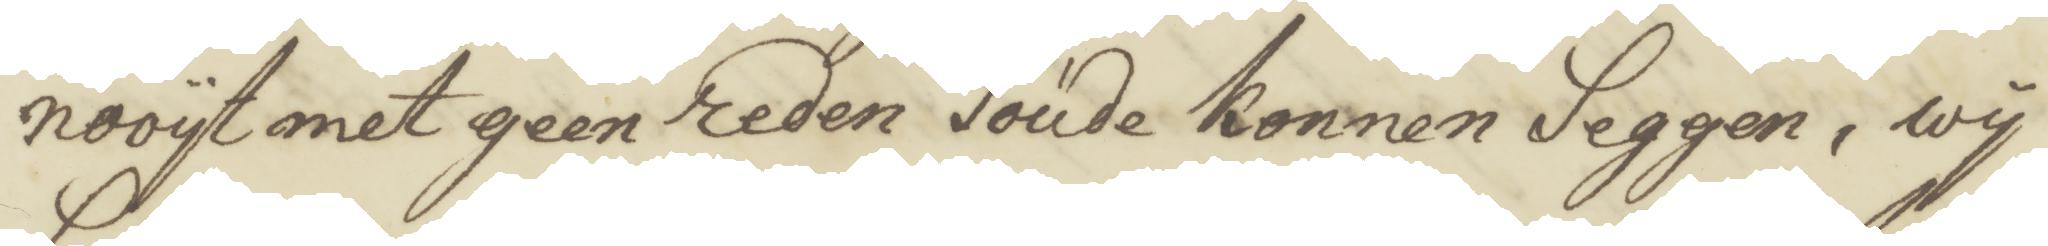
nooijt met geen reden soude konnen seggen, wij
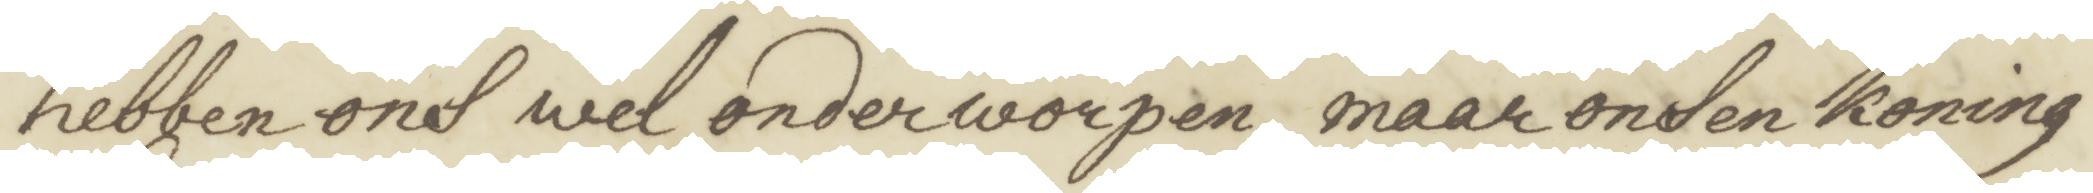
hebben ons wel onderworpen maar onsen koning
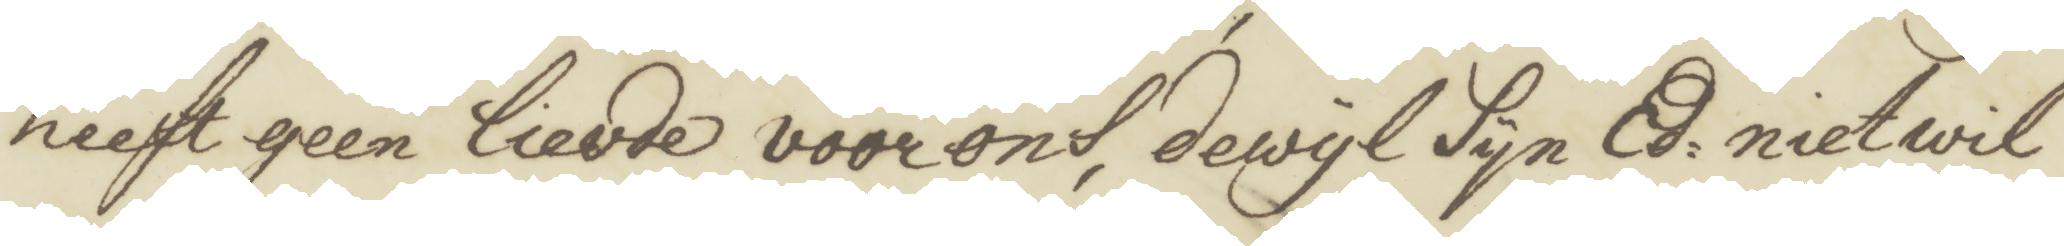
heeft geen lievde voor ons, dewijl sijn Ed: niet wil
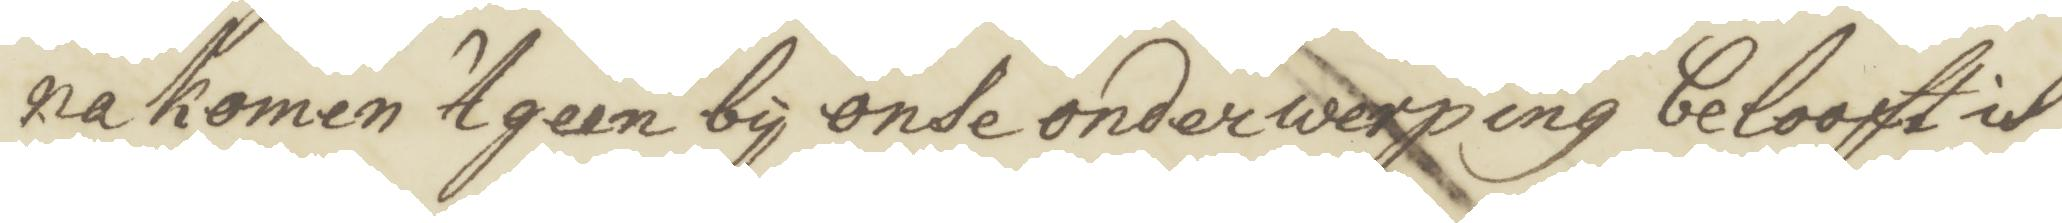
na komen ’t geen bij onse onderwerping belooft is,
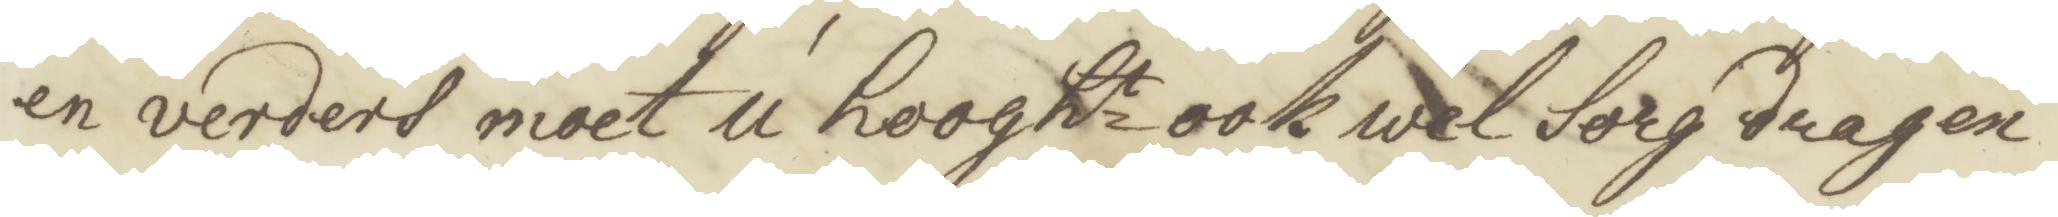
en verders moet u hoogh=t ook wel sorg dragen
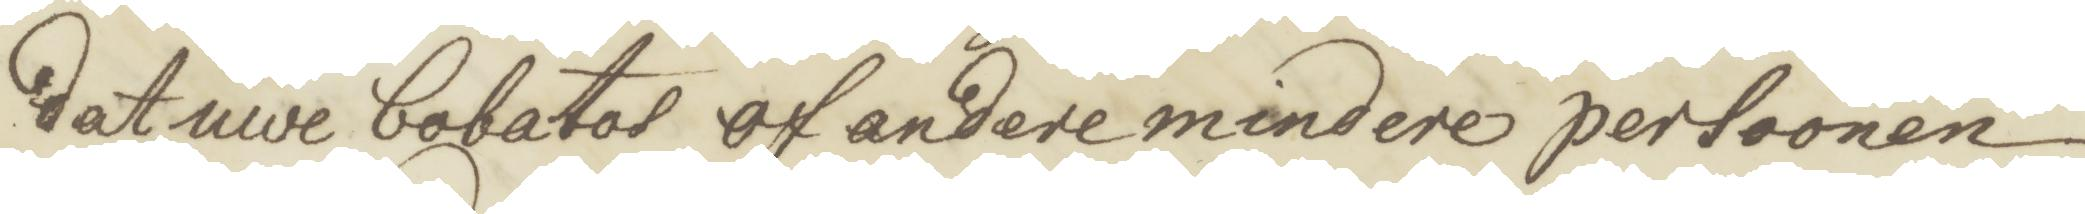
dat uwe bobatos of andere mindere persoonen
